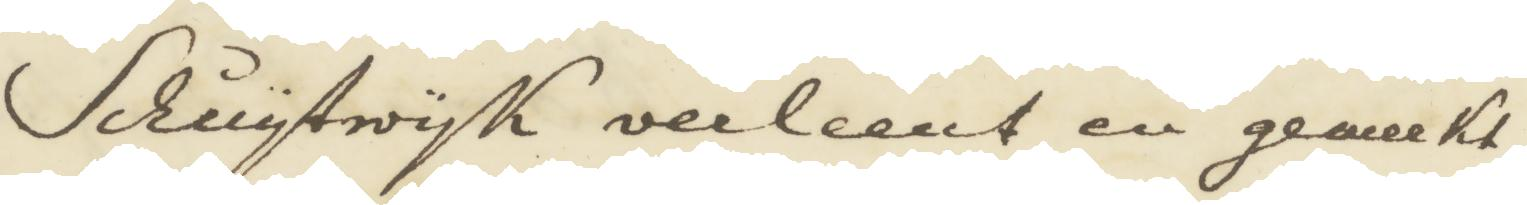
schuijtwijk verleent en gemerkt
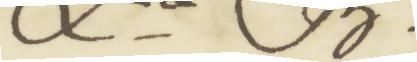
L-ra B.
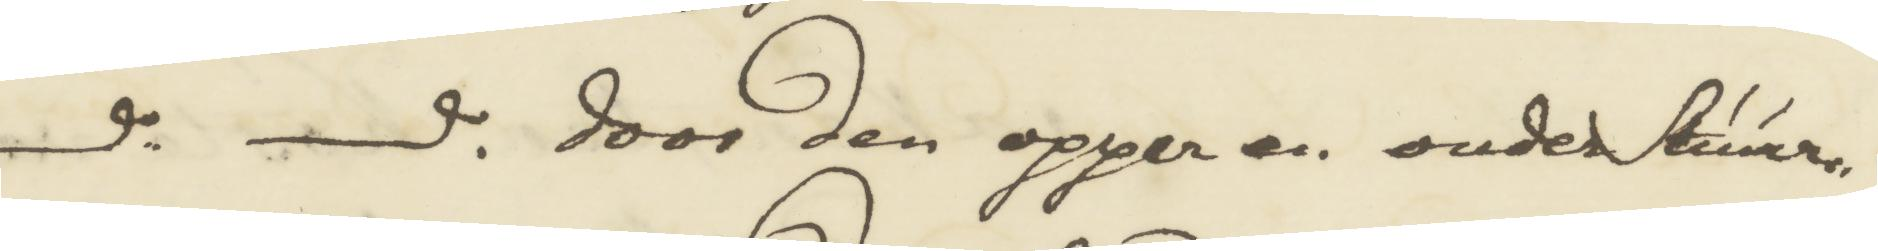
_„o _.o door den opper en onder stuur„
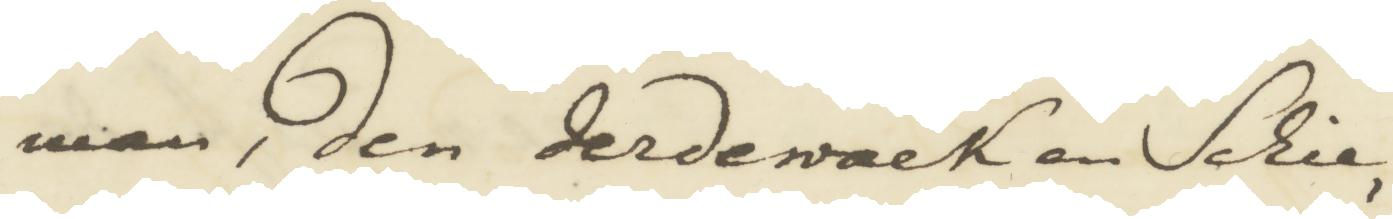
man, den derdewaek en schie,
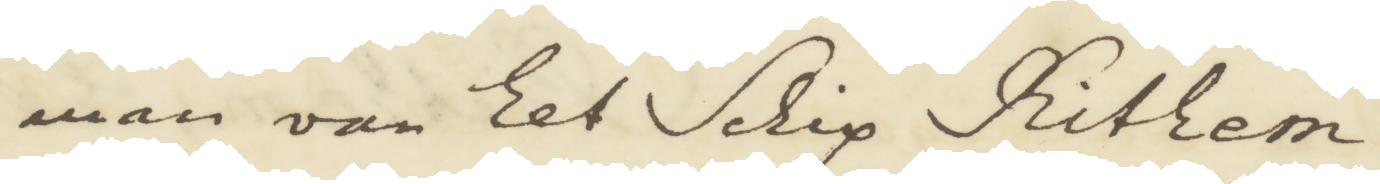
man van het schip Rithem
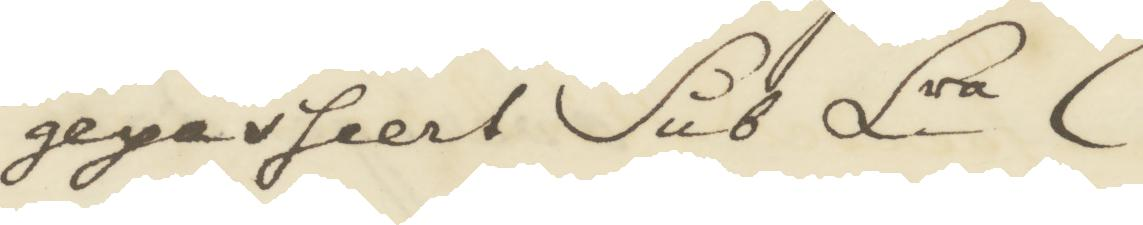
gepasseert sub L-ra C
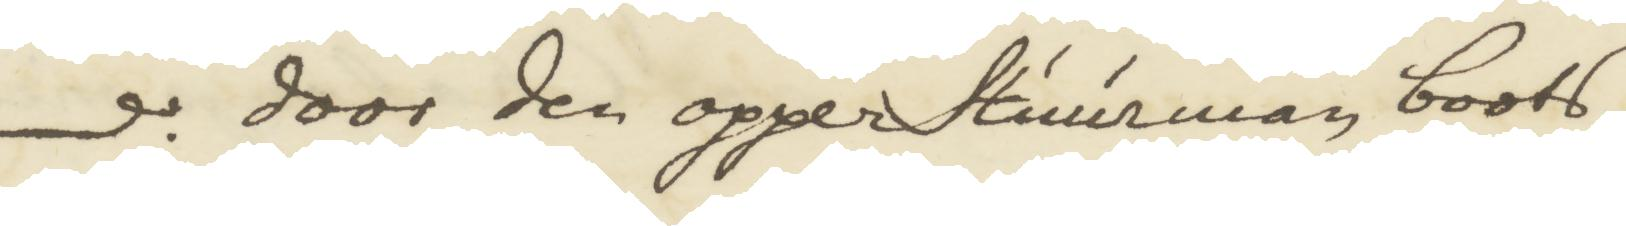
_.o _.o door den opperstuurman boots.
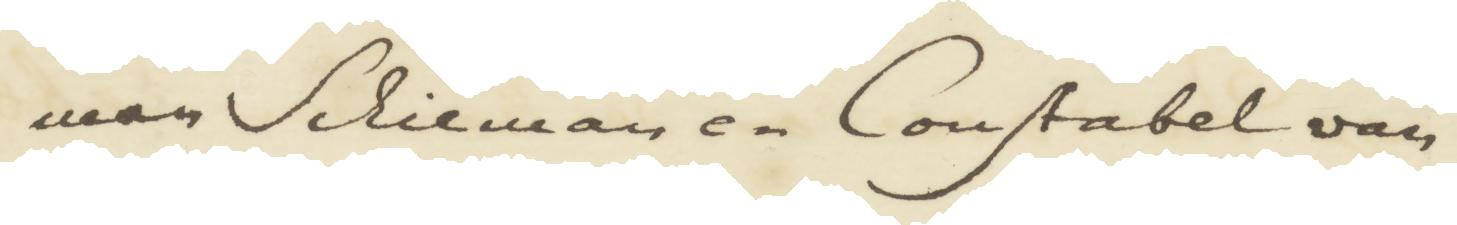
man schieman en Constabel van
